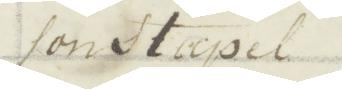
Constapel
